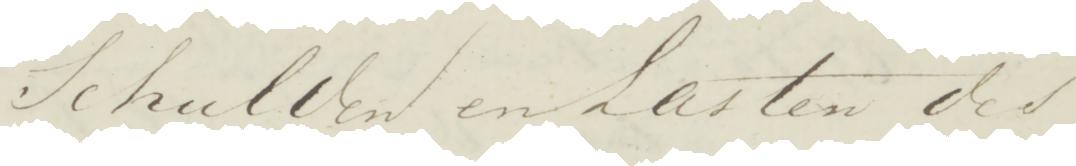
schulden en Lasten des
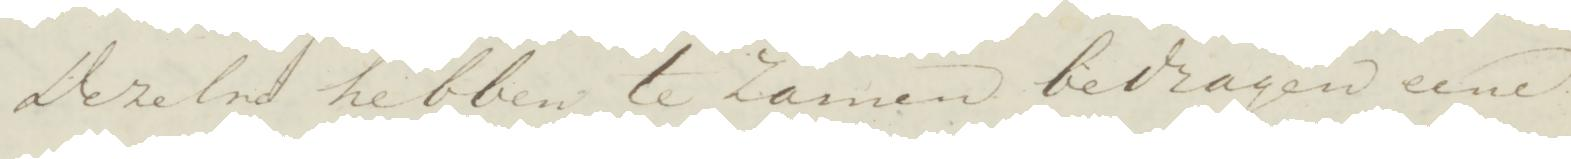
Dezelve hebben te zamen bedragen eene
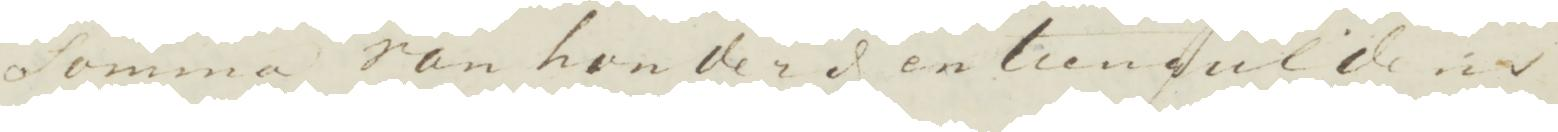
somma van honderd en tien guldens
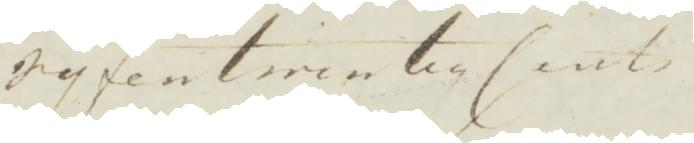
vijf en twintig Cents
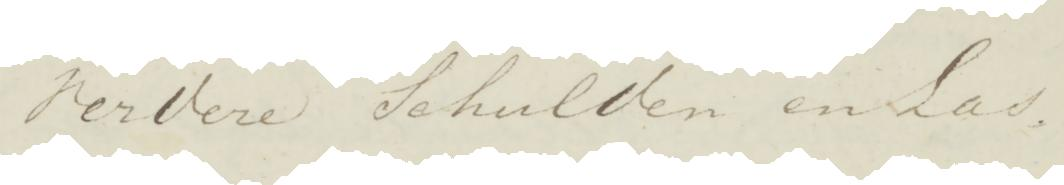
Verdere schulden en Las.
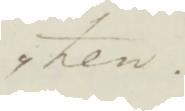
„ten.
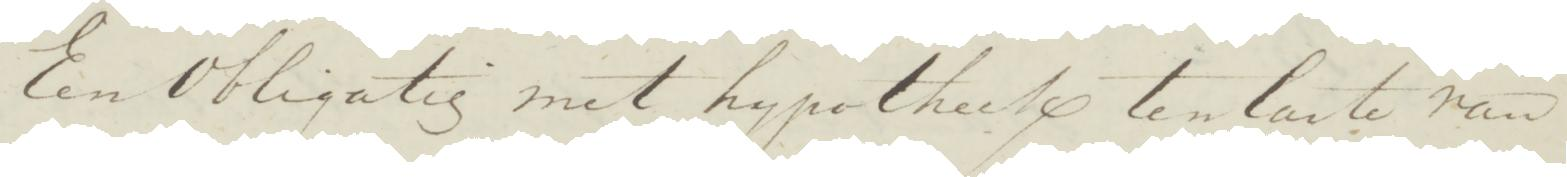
Een obligatie met hypotheek ten laste van
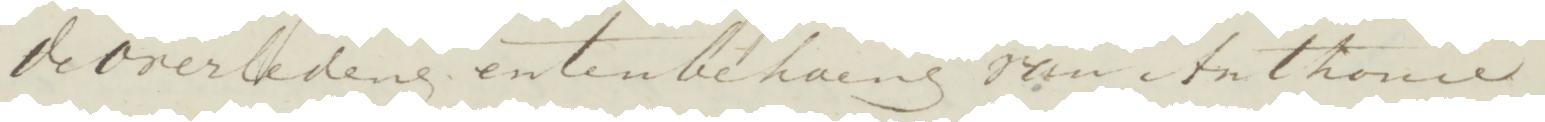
de overledene en ten behoeve van Anthonie
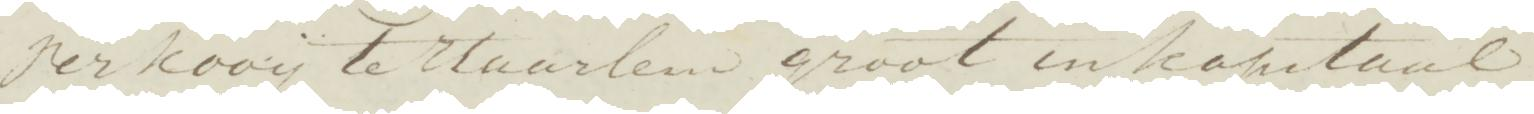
Verkooij te Haarlem groot in kapitaal
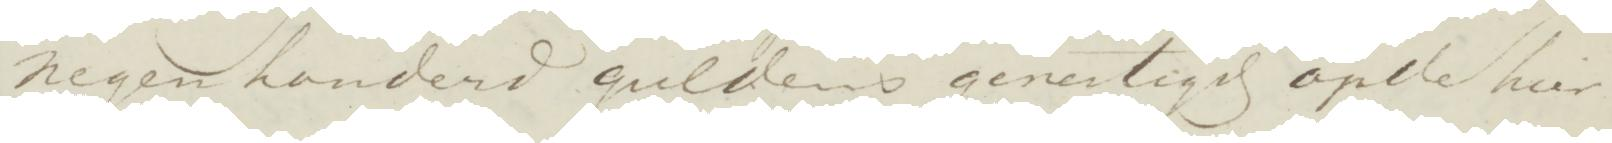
negenhonderd guldens gevestigd op de hier
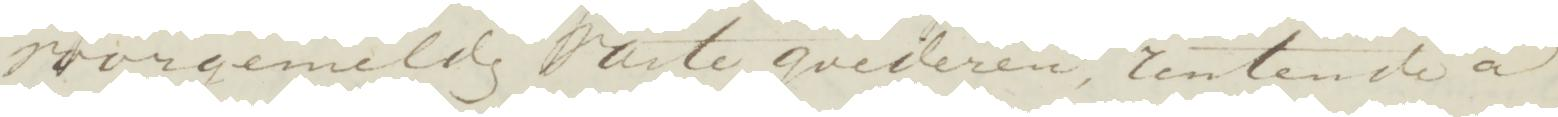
voorgemelde vaste goederen, rentende a
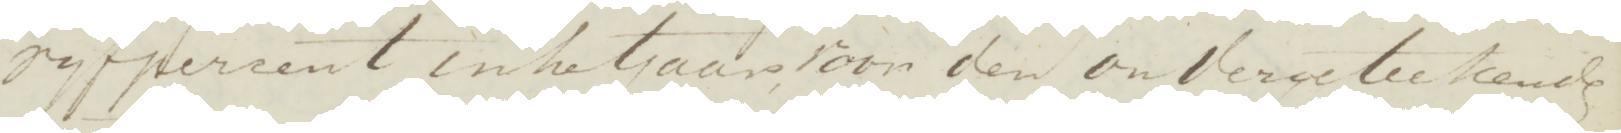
vyf percent in het jaar, voor den onvergeteekende
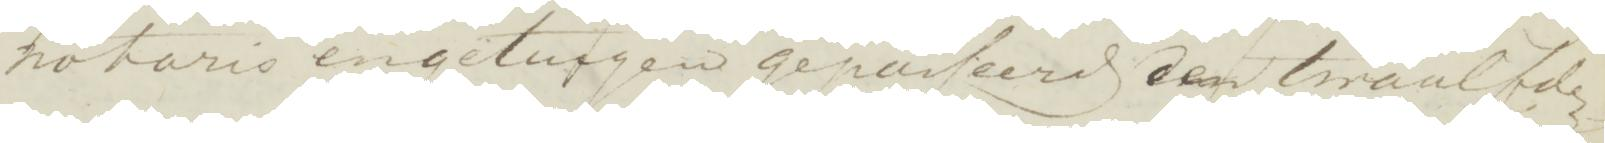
notaris en getuigen gepasseerd den twaalfden
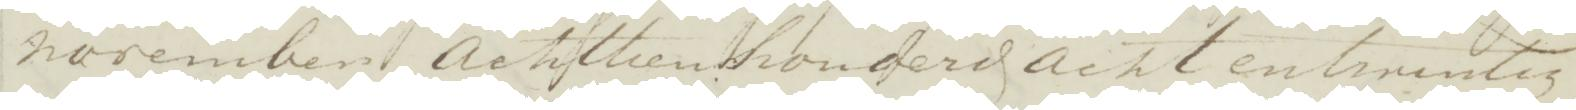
november Achttienhonderd acht en twintig
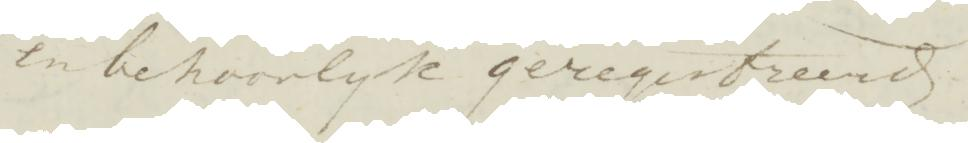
en behoorlyk geregistreerd
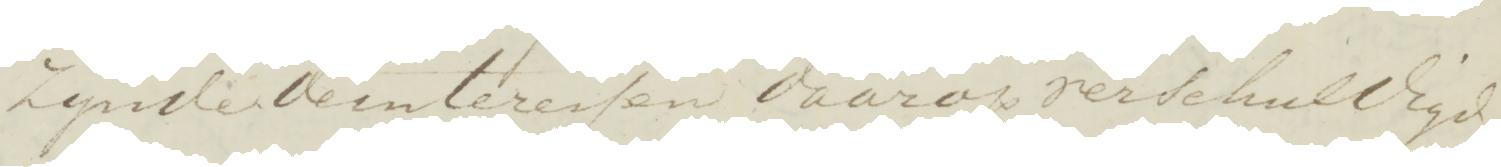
zijnde de interessen daarop verschuldigd
